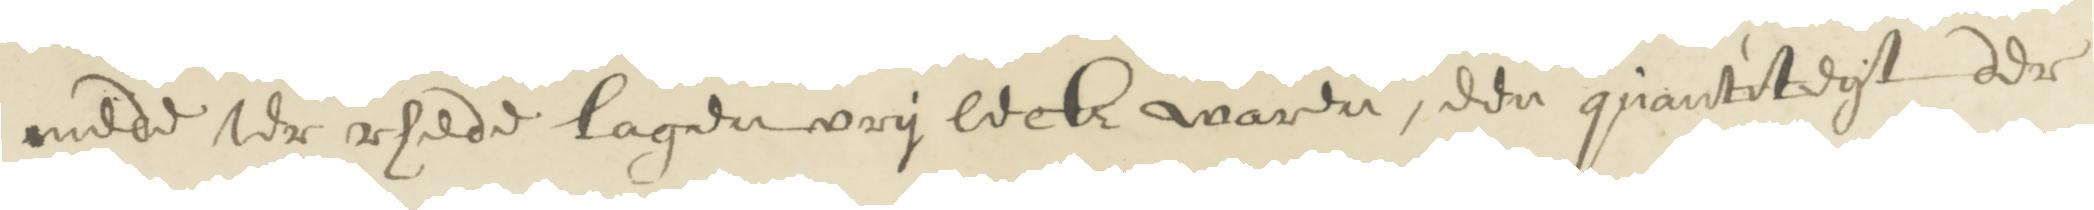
mede ter rhede lagen vrijleck waren, een quantiteijt der
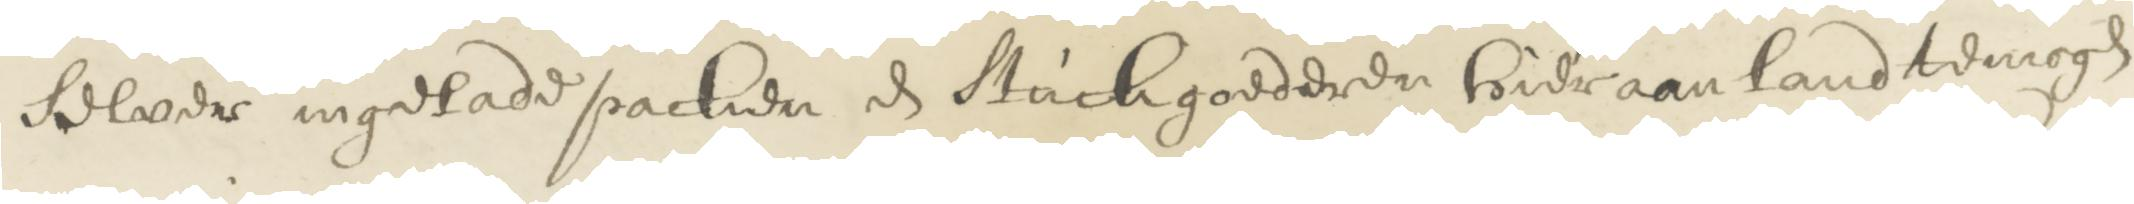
selver ingelade packen en stuckgoederen hier aan land te mogen
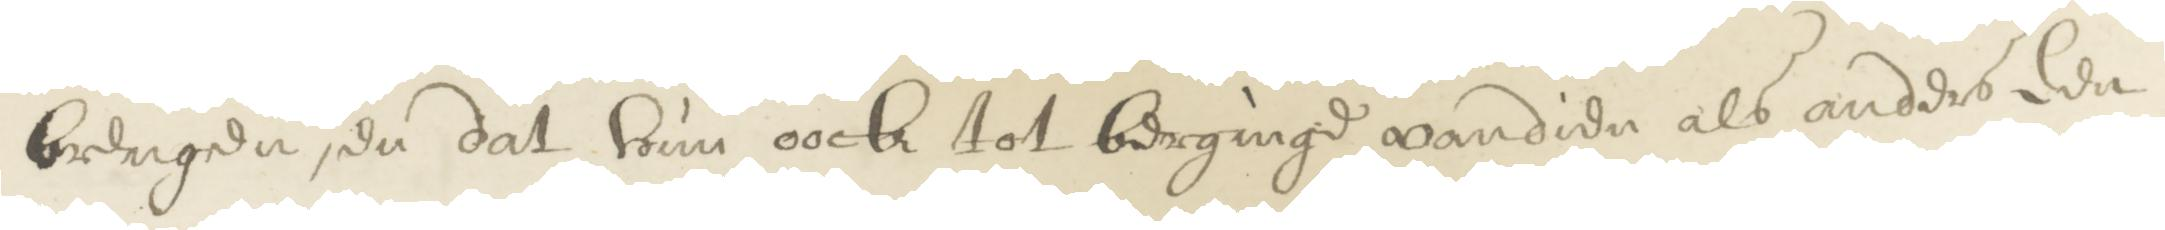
brengen, en dat hun oock tot berginge van dien als anders den
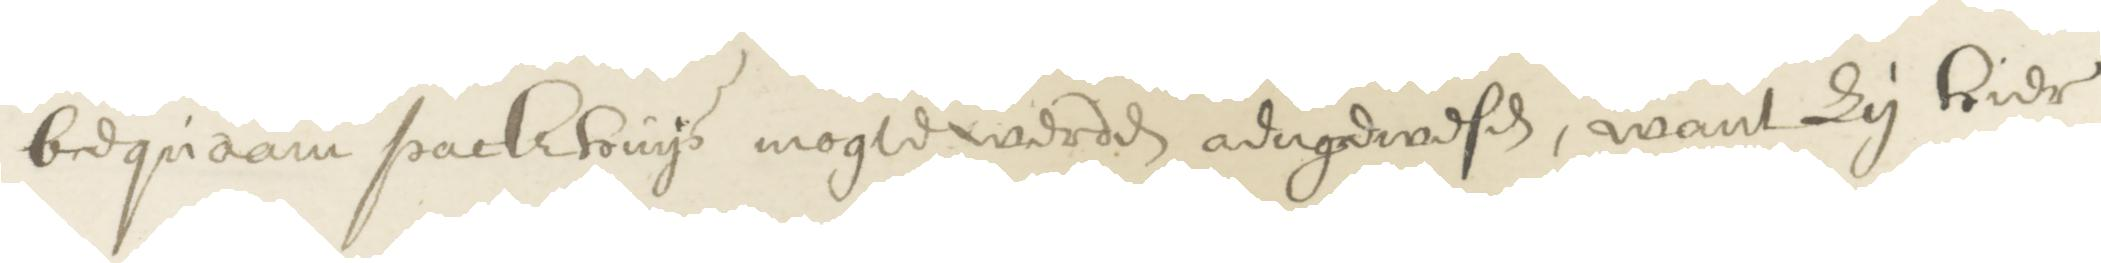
bequaam packhuijs mogte werden aengewesen, want zij hier
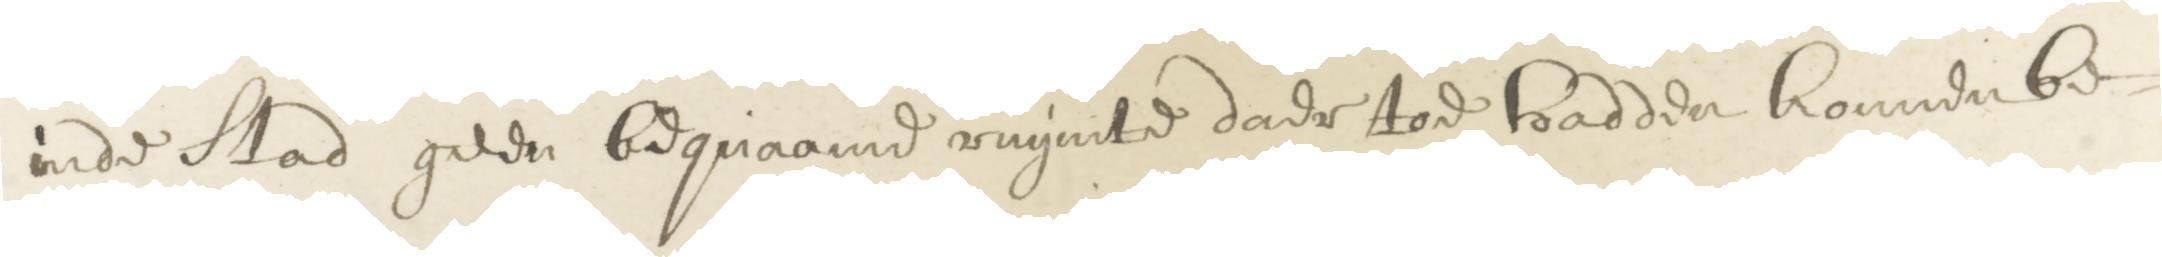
inde stad geen bequaame ruijmte daer toe hadden konnen be=
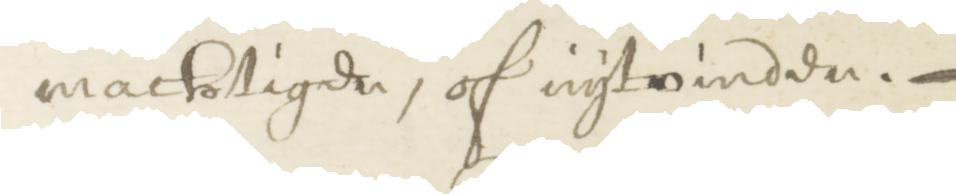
machtigen, of uijtvinden. –
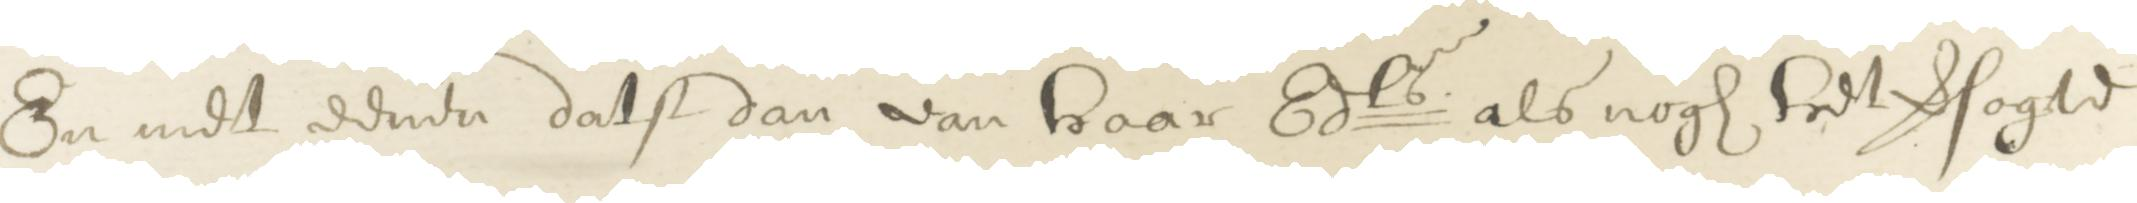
En met eenen datst dan van haar Ed=ls als nogh het versogte
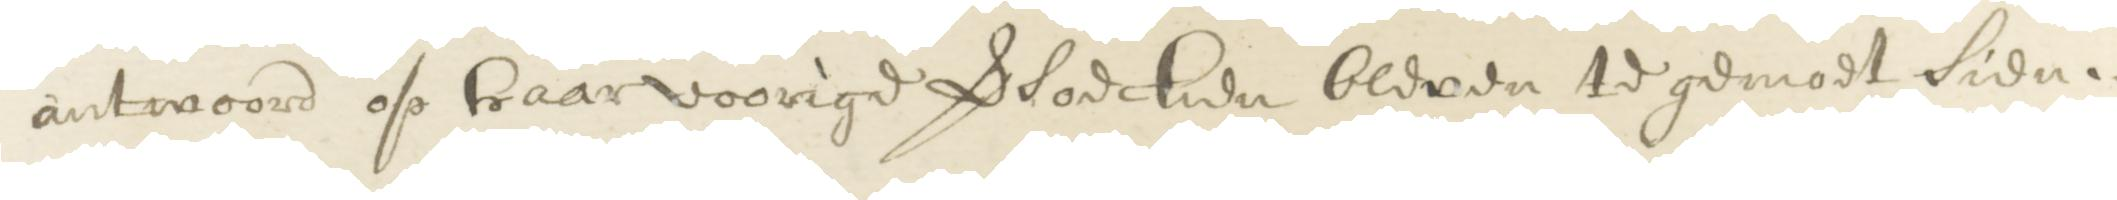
antwoord op haar voorige versoecken bleven te gemoet sien
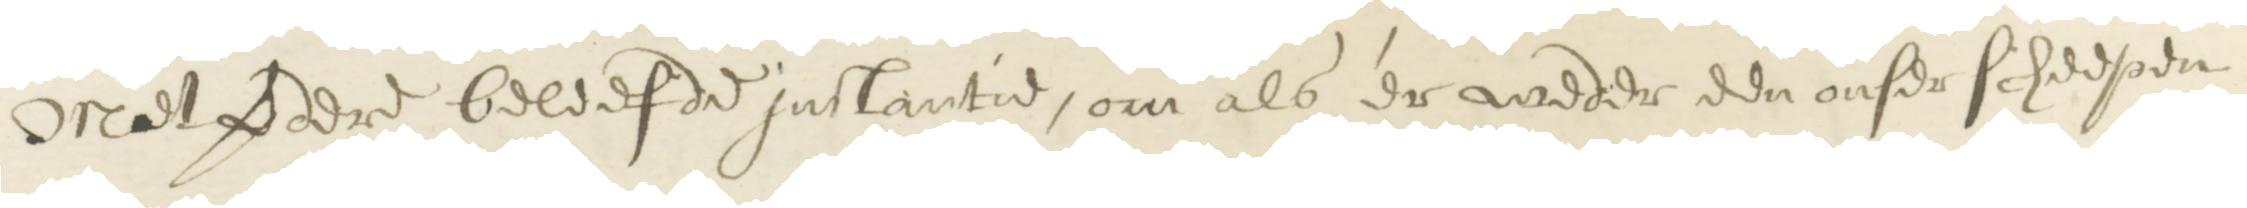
Met verdere beleefde instantie, om als 'er weder een onser scheepen
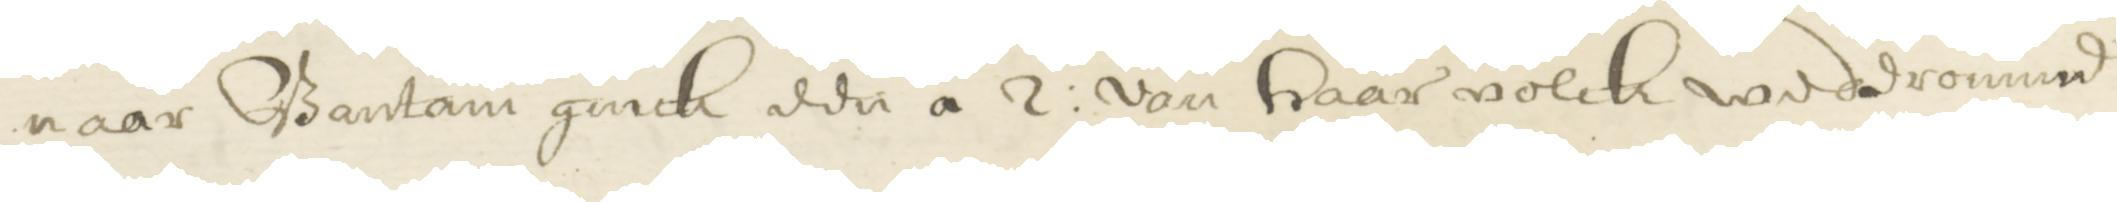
naar Bantam ginck een â 2: van haar volck wederomme
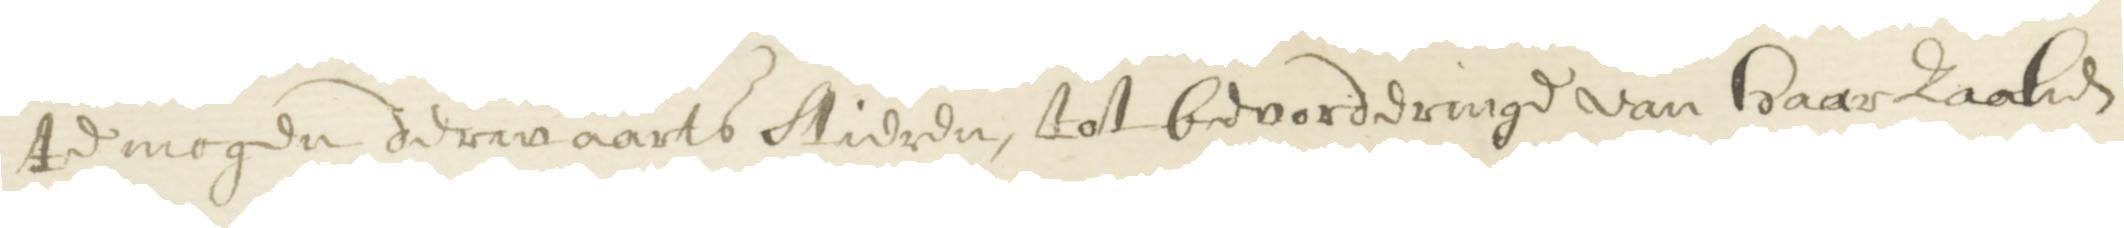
te mogen derwaarts stieren, tot bevorderinge van haar zaaken
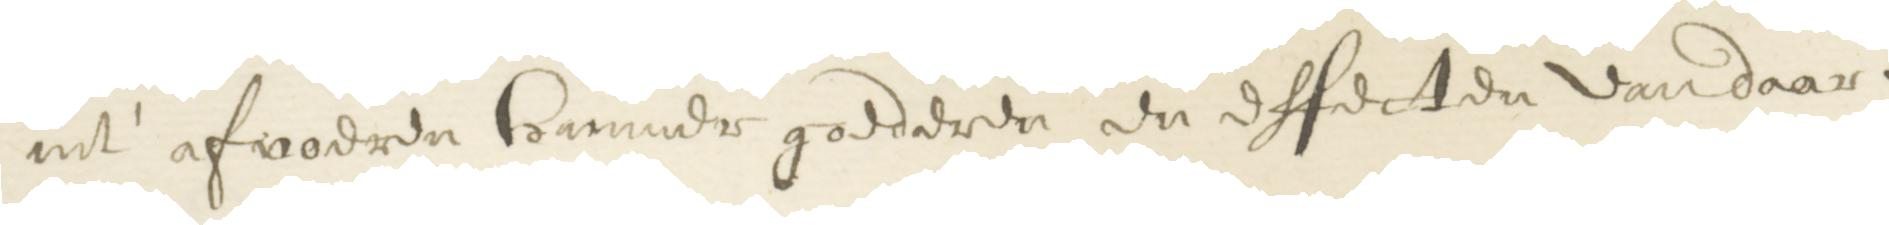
int' afvoeren hunner goederen en effecten van daar
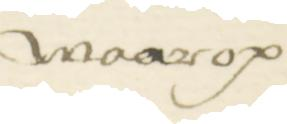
waarop
